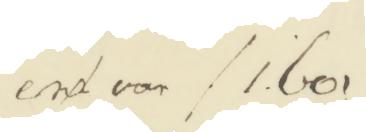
enz van ƒ1.60 }
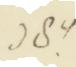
38'
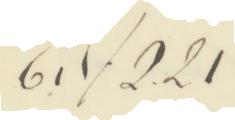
61} ƒ 2.21
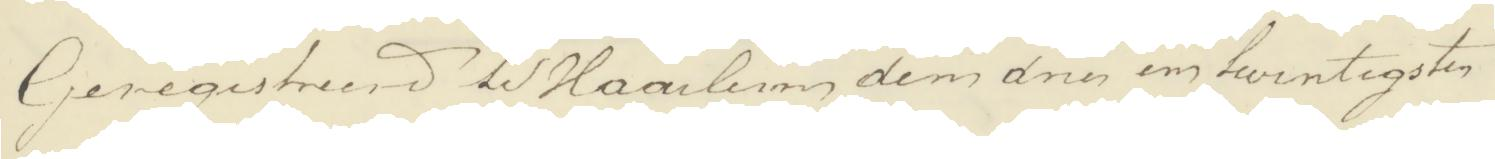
Geregistreerd te Haarlem, den drie en twintigsten
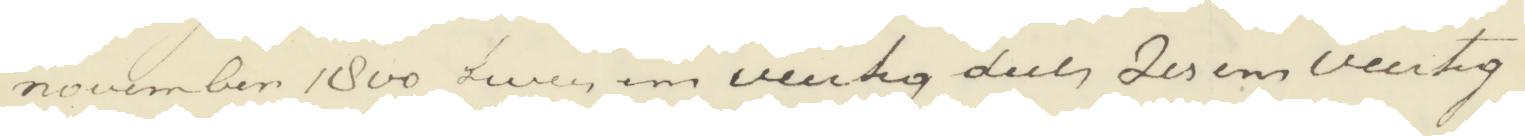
november 1800 twee en veertig deel zes en veertig
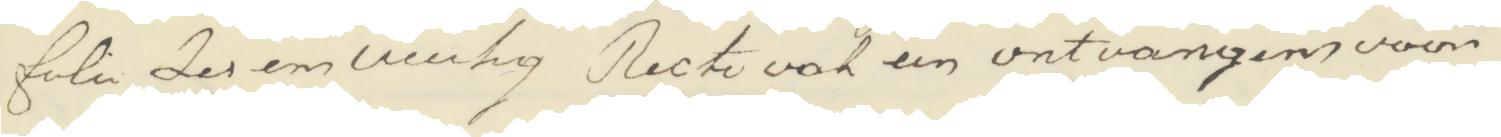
folio Zes en veertig Recto vak een ontvangen voor
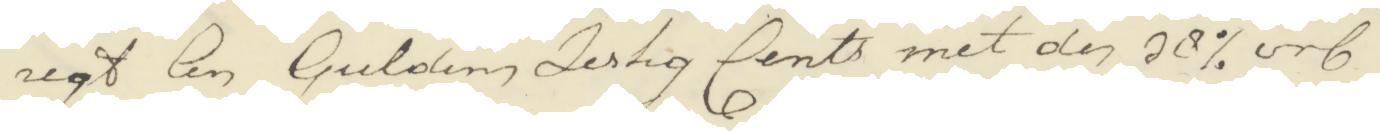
regt Een Guldens Zestig Cents met den 38% opC
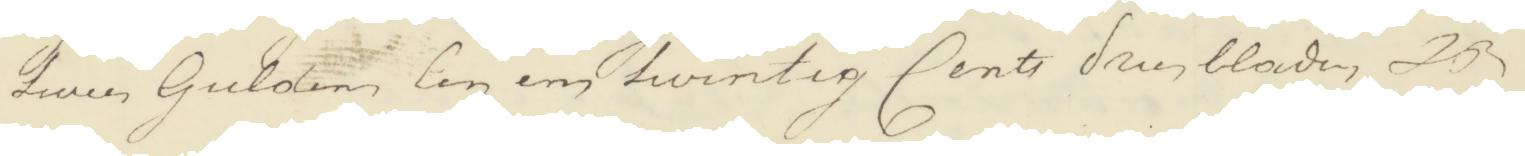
Twee Guldens Een en twintig Cents drie bladen ZR
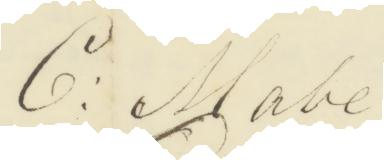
C: Mabé
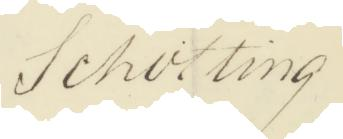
Scholting
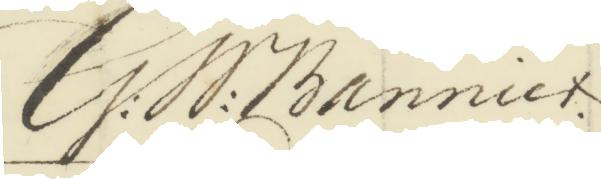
G: W: Bannier:
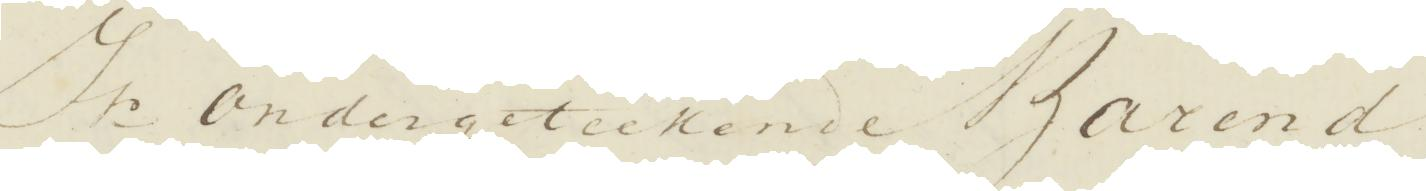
Ik ondergeteekende Barend.
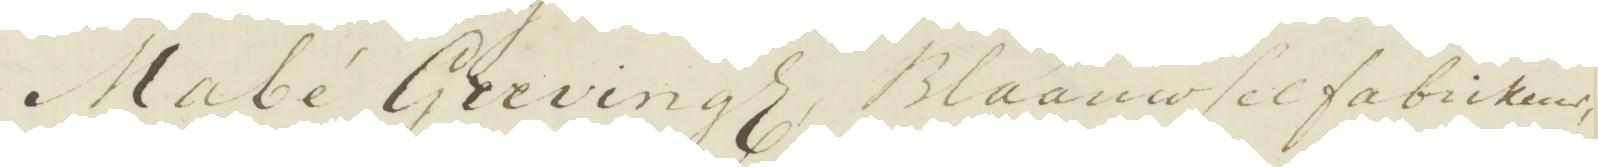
Mabé Grevingh, Blaauwsel fabrikeur,
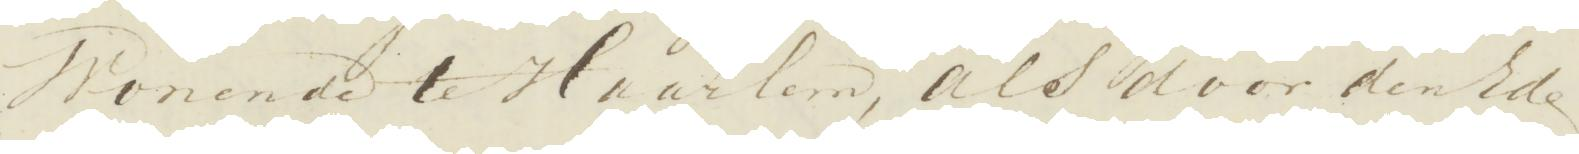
Wonende te Haarlem, als door den Ede
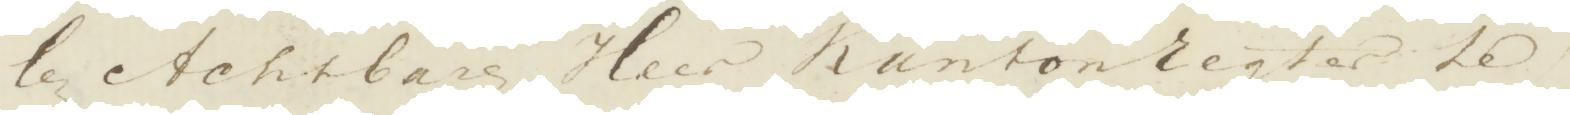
len Achtbaren Heer Kanton regter te
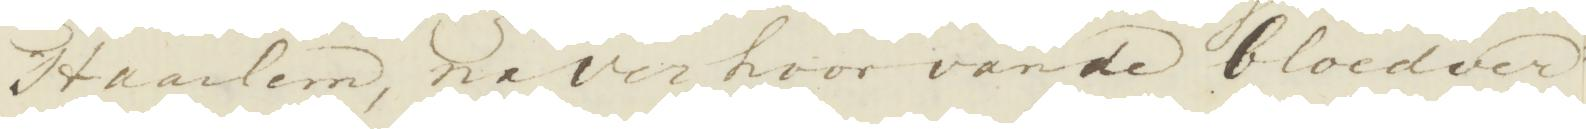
Haarlem, na verhoor van de bloedver
